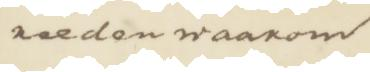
reeden waarom
